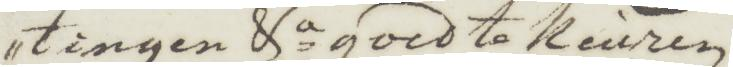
„tingen &=a goed te keuren
